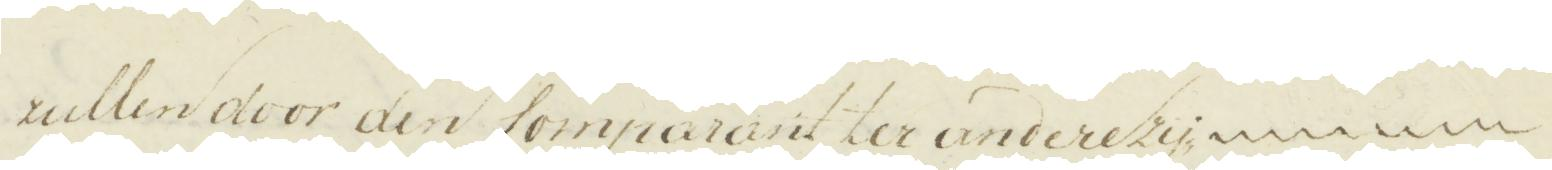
zullen door den Comparant ter andere zij„ —
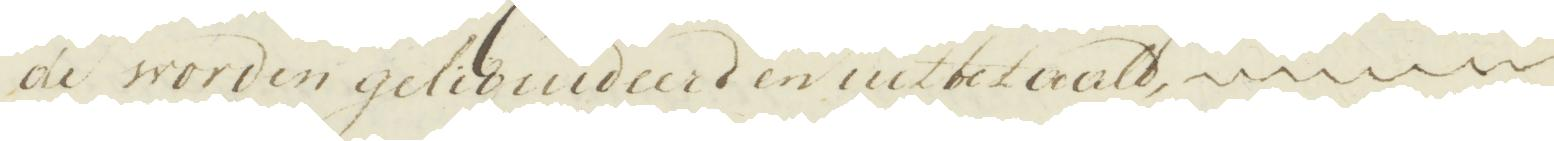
,de worden geliquideerd en uitbetaald, —
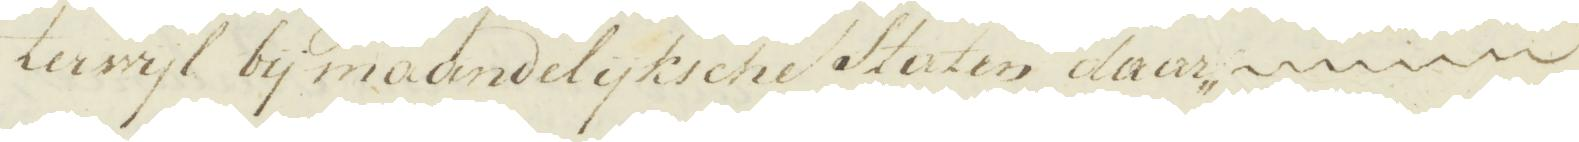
terwyl bij maandelyksche staten daar„ —
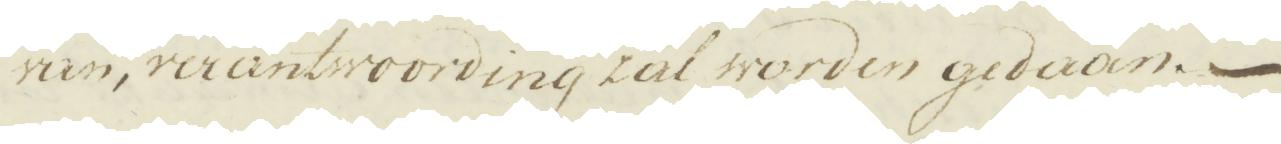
van, veranwoording zal worden gedaan. —
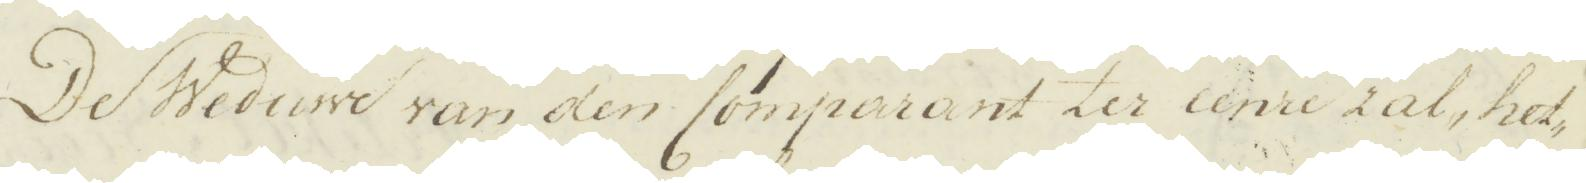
De Weduwe van den Comparant ter eenre zal, het„
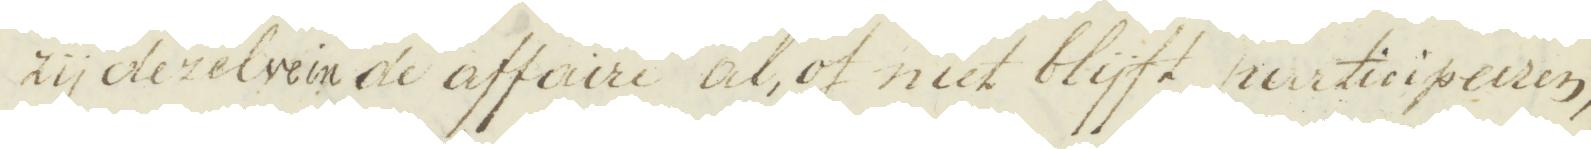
zij dezelve in de affaire al, of niet blijft participeeren,
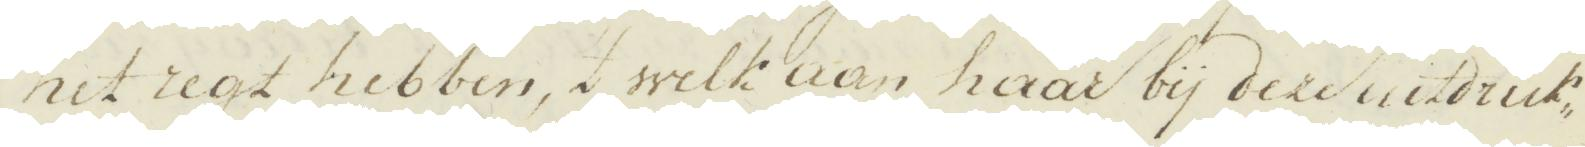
het regt hebben, 't welk aan haar bij deze uitdruk„
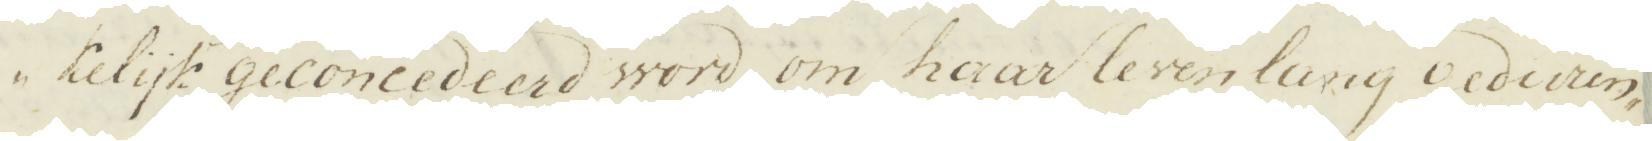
„ kelijk geconcedeerd word, om haar leven lang geduren„
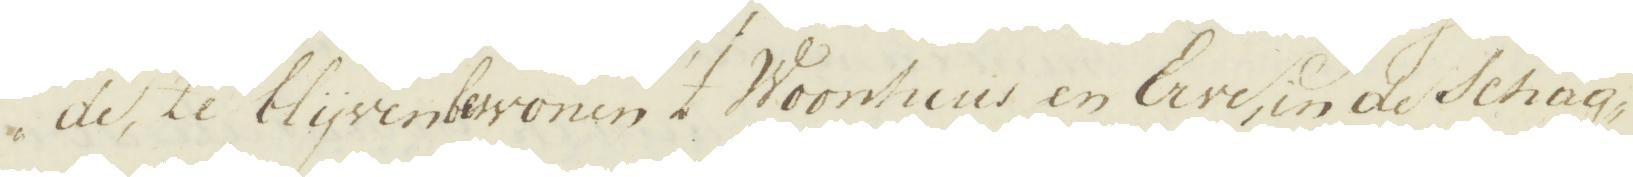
„ de, te blijven bewonen 't Woonhuis en Erve, in de schag„
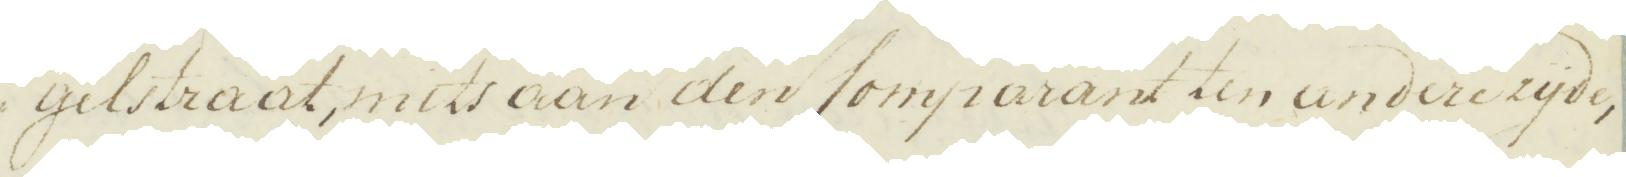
gelstraat, mits aan den Comparant ten andere zijde,
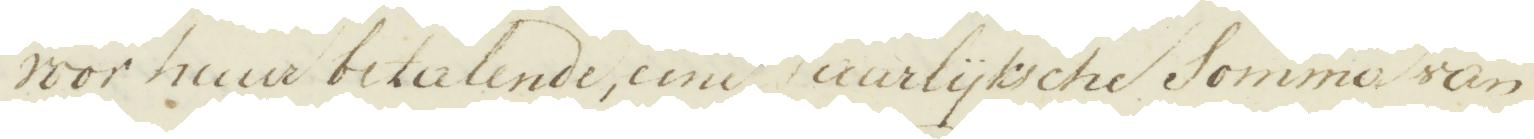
voor huur betalende, eene Jaarlijksche somma van
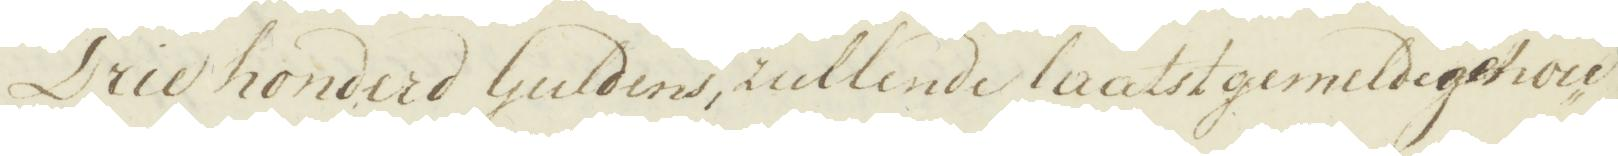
Drie honderd Guldens, zullende laatst gemelde gehou„
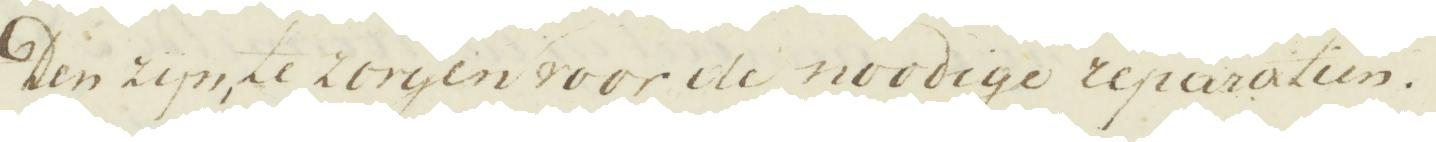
den zijn, te zorgen voor de noodige reparatien.
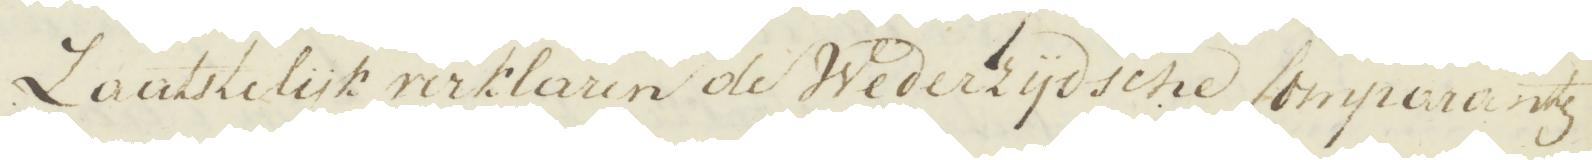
Laatstelijk verklaren de Wederzijdsche Comparanten
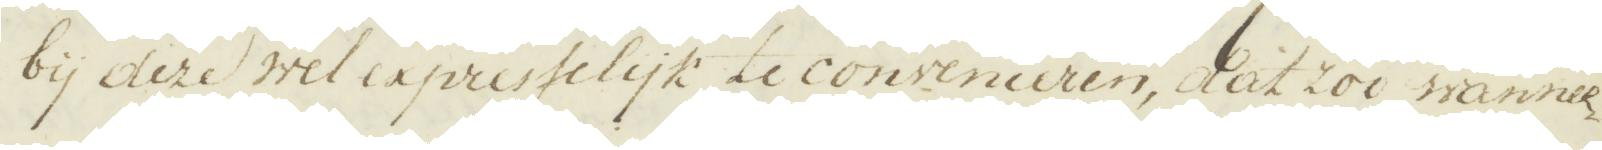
bij deze wel expresselijk te convenieren, dat zoo wanneer
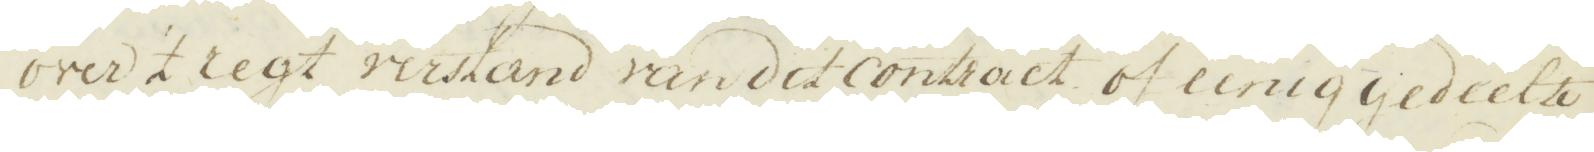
over ’t regt verstand van dit contract of eenig gedeelte
